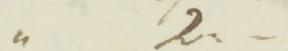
„ 2: –
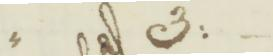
„ 3: –
